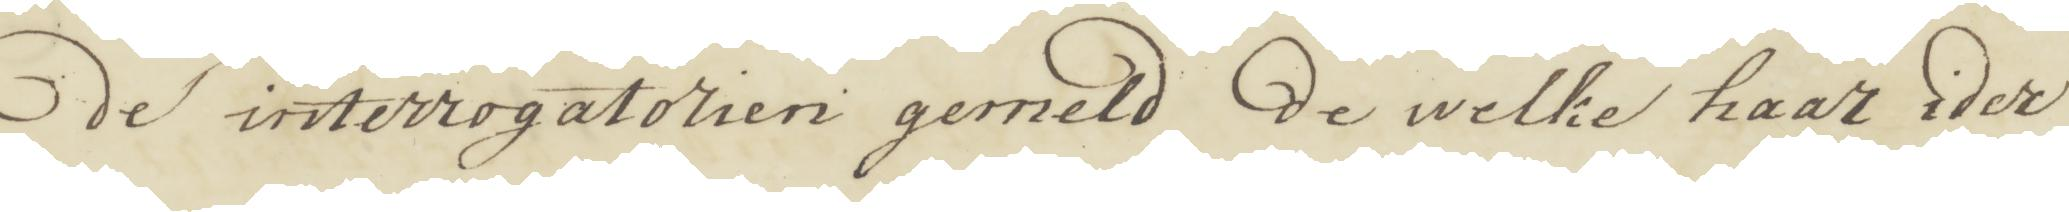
de interrogatorien gemeld de welke haar ider
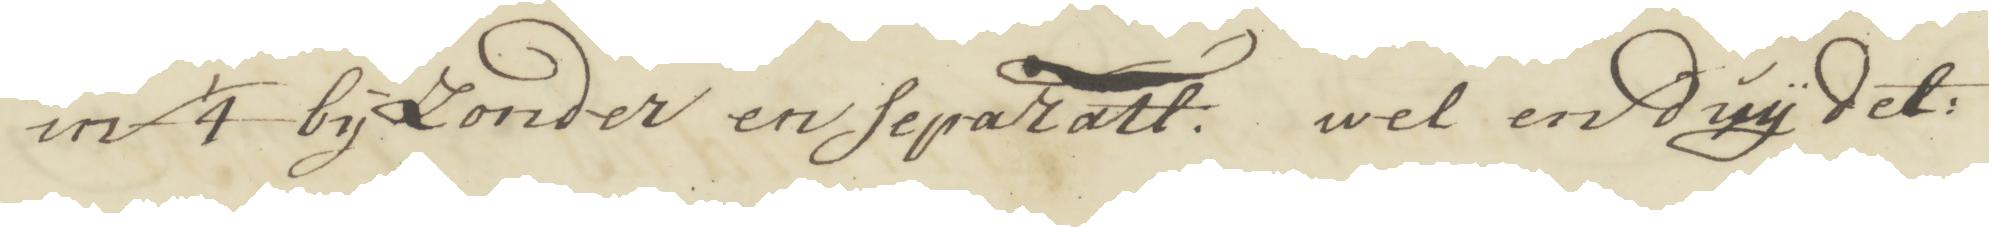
in ’t bijzonder en separatlijk wel en duijdelijk
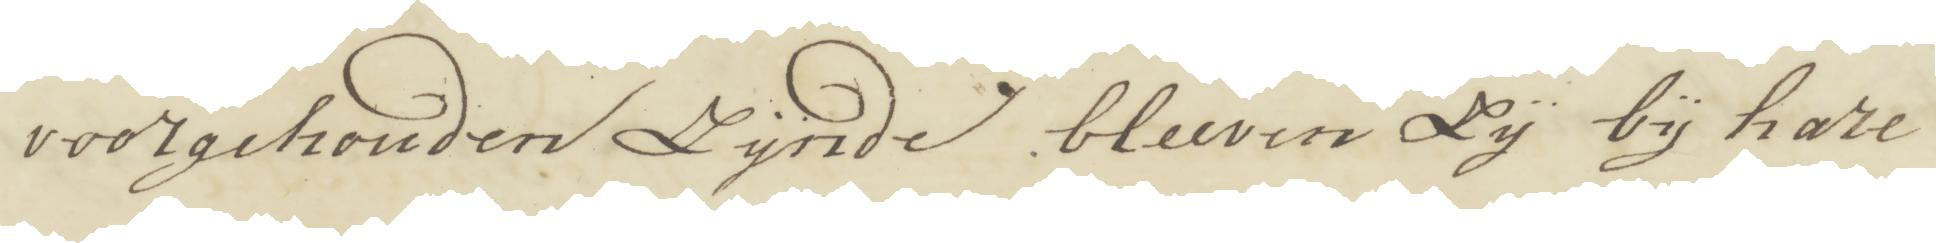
voorgehouden Zijnde bleeven Zij bij hare
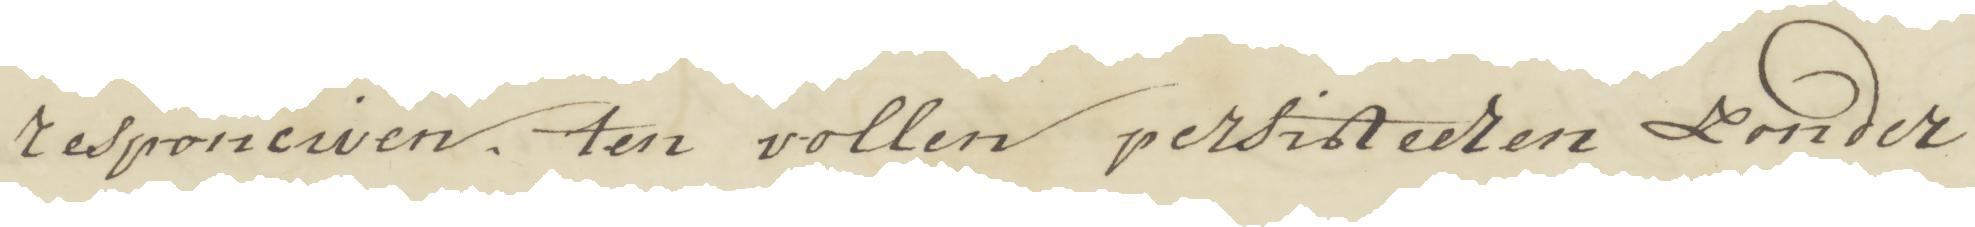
responciven. ten vollen persisteeren zonder
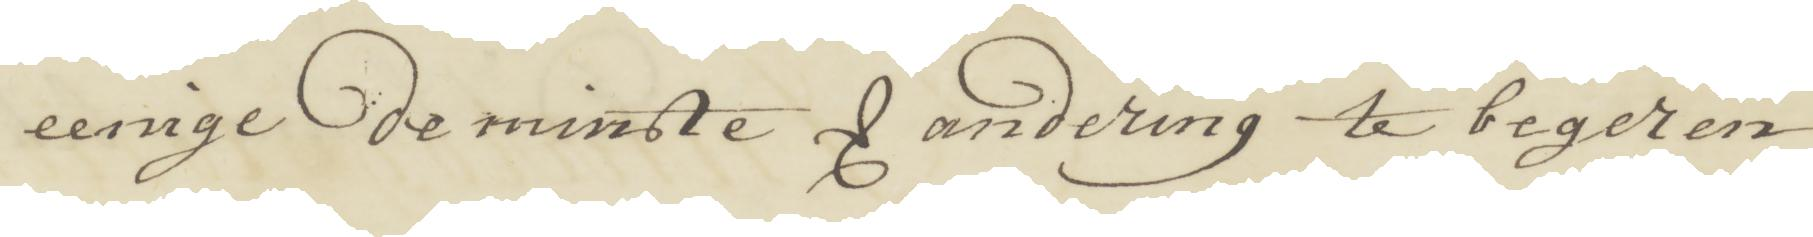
eenige de minste verandering te begeren
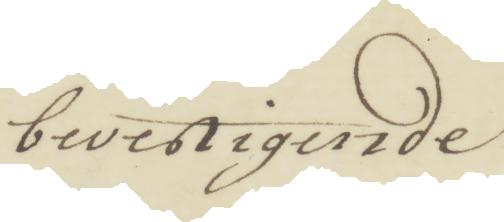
bevestigende
